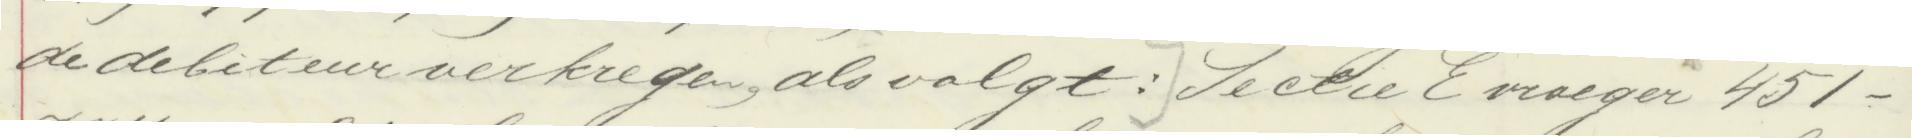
de debiteur verkregen, als volgt: Sectie E vroeger 451-
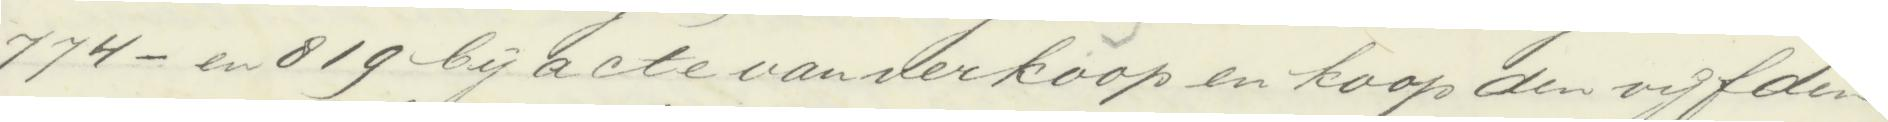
774- en 819 bij acte van verkoop en koop den vijfden
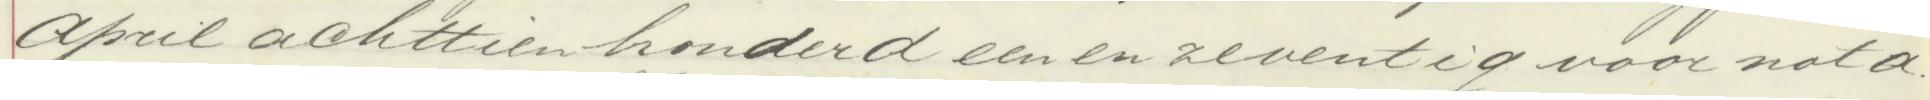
april achttien honderd een en zeventig voor nota
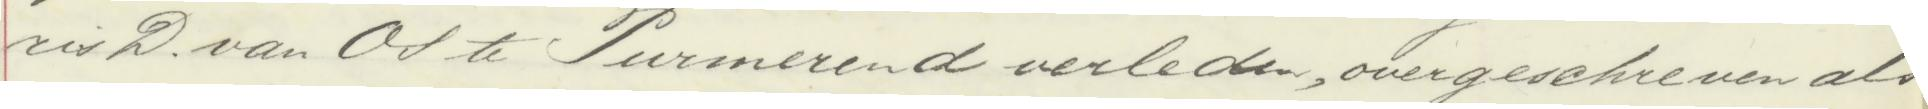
ris D. van Os te Purmerend verleden, overgeschreven als
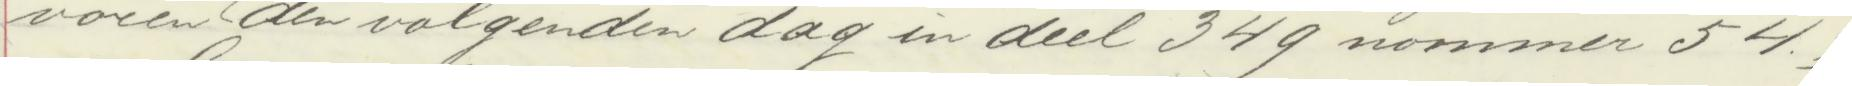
voren den volgenden dag in deel 349 nommer 54.;
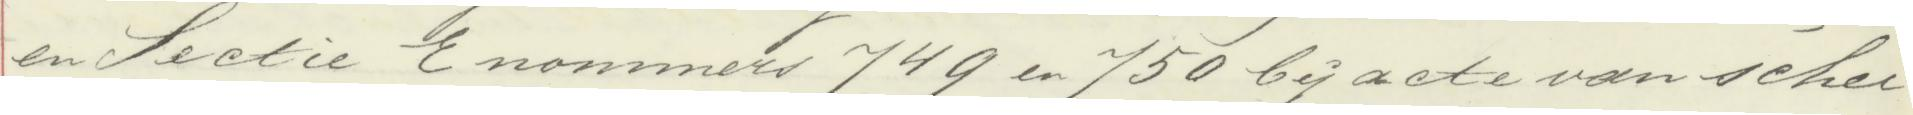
en Sectie E nommers 749 en 750 bij acte van schei
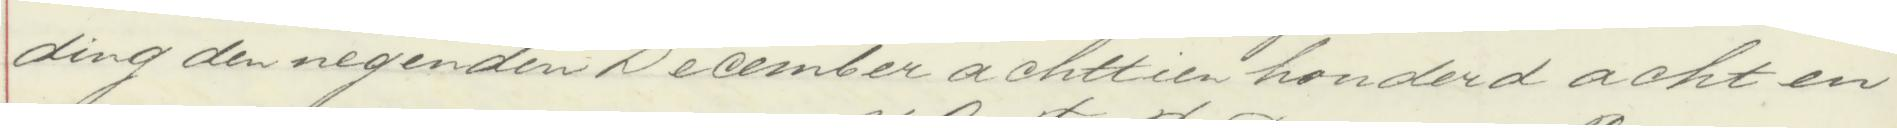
ding den negenden December achttien honderd acht en
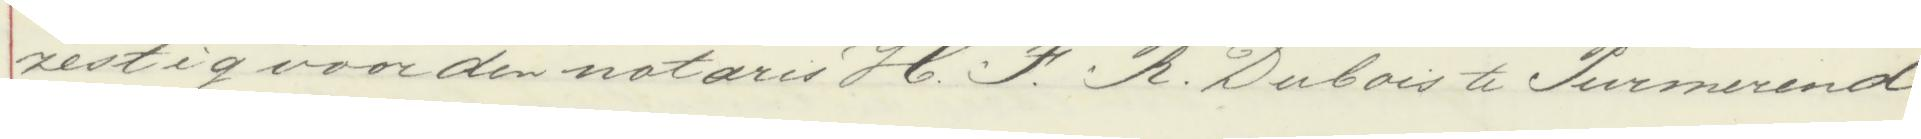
zestig voor den notaris H. F. R. Dubois te Purmerend
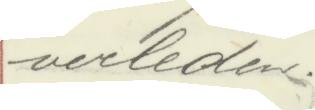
verleden
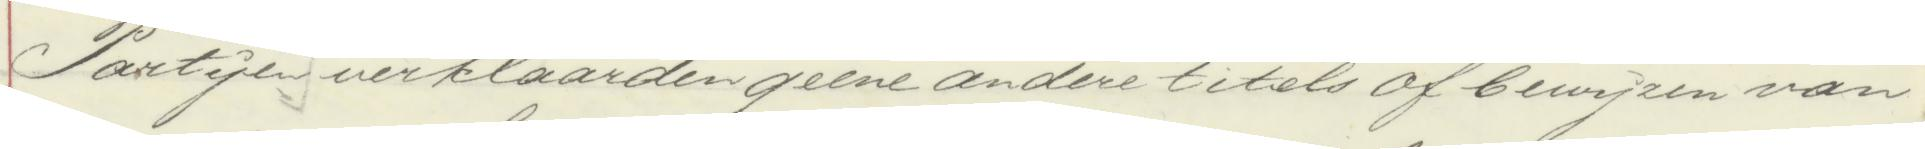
Partijen verklaarden geene andere titels of bewijzen van
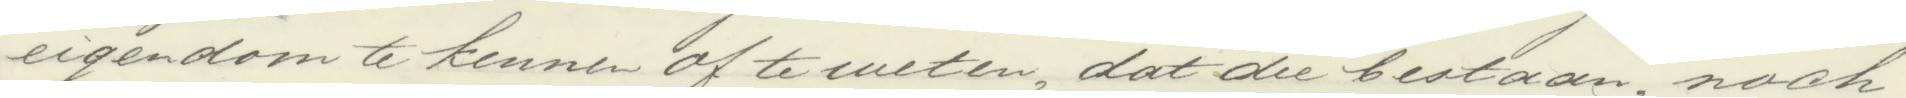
eigendom te kennen of te weten, dat die bestaan, noch
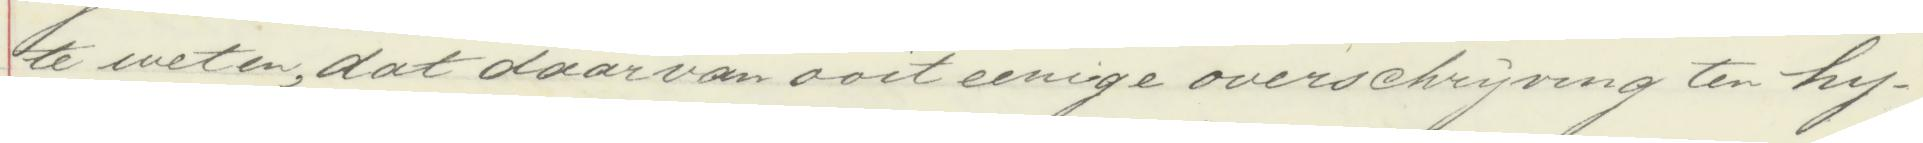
te weten, dat daarvan ooit eenige overschrijving ten hy-
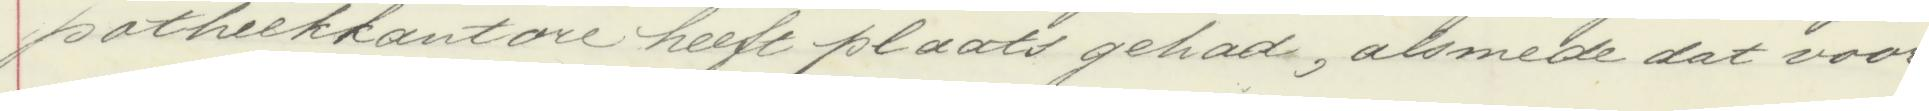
potheekkantore heeft plaats gehad, alsmede dat voor
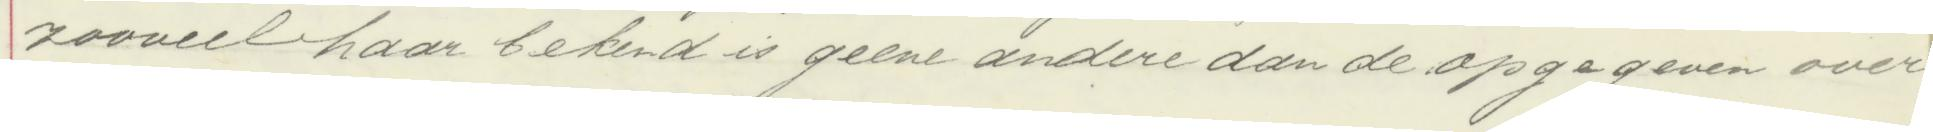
zooveel haar bekend is geene andere dan de opgegeven over
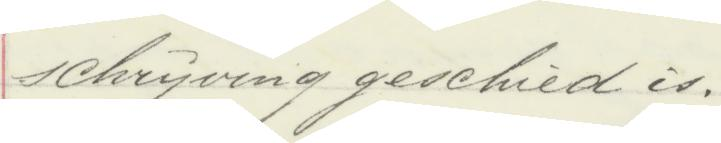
schrijving geschied is.
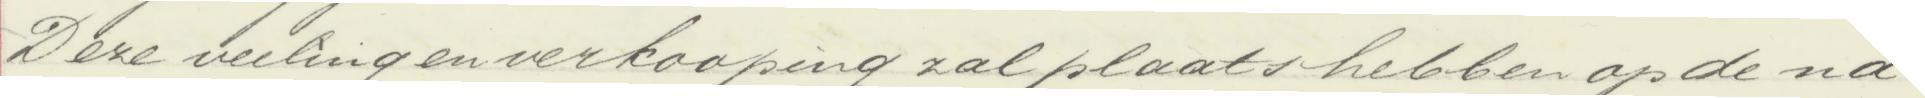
Deze veiling en verkooping zal plaats hebben op de na
